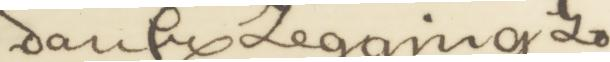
dank zegging zo
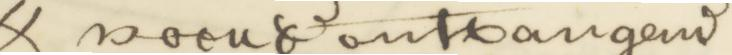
„ voor E' ontvangene
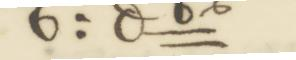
6: d=os
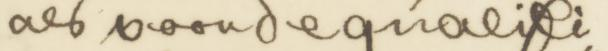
als voor de qualifi„
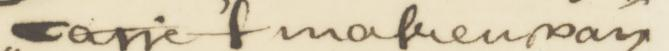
„catie 't maken van
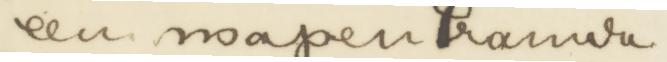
een wapen kamer
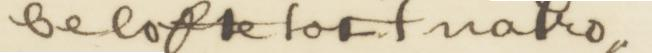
belofte tot 't nako„
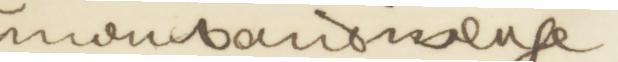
men van diverse
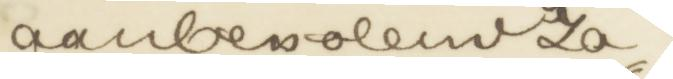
aanbevolene za„
